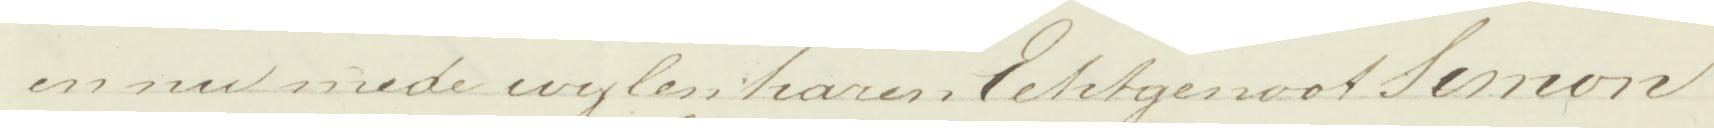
en nu mede wylen haren Echtgenoot Simon
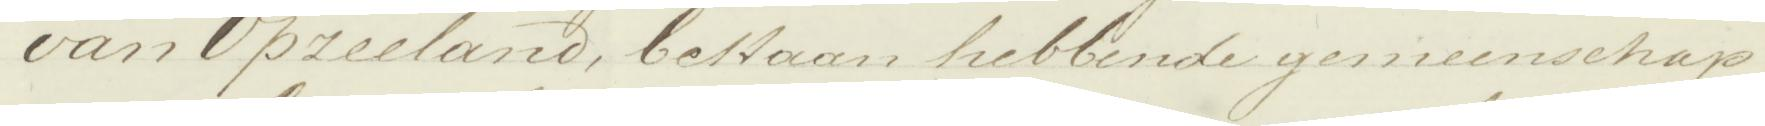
van Opzeeland, bestaan hebbende gemeenschap
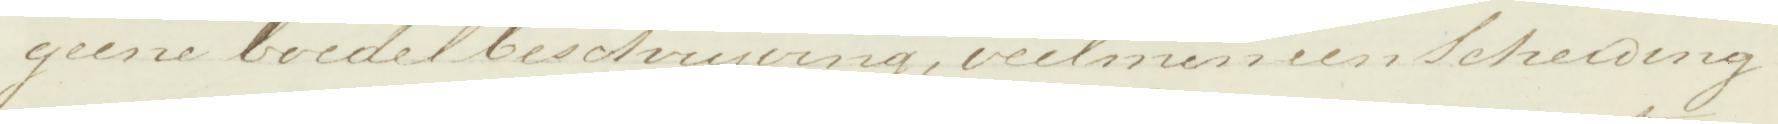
geene boedel beschryving, veelmen een scheiding
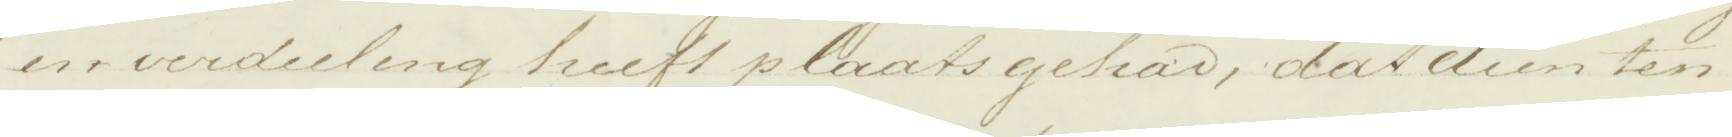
in verdeeling heeft plaatsgehad, dat dien ten
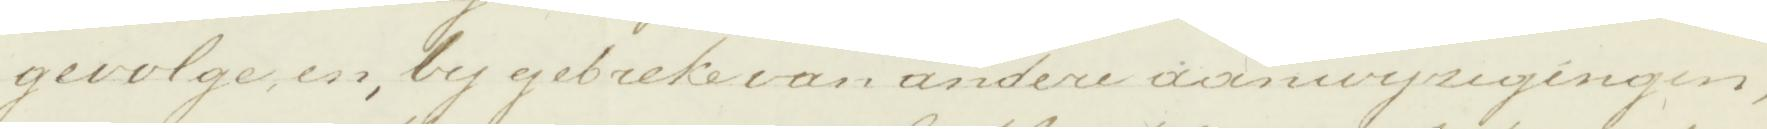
gevolge, en, by gebreke van andere aanwyzigingen
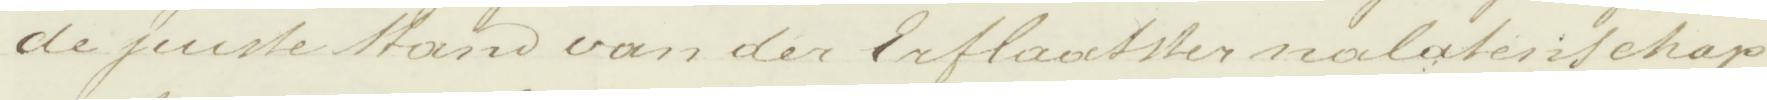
de juiste stand van der Erflaatster nalatenschap
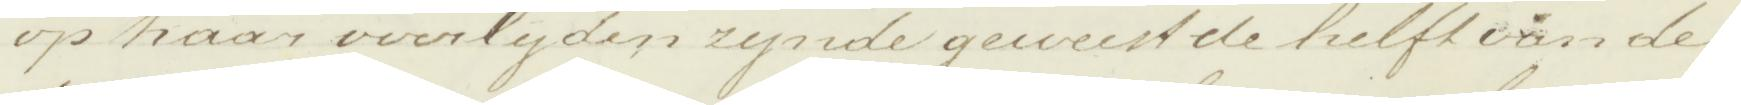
op haar overlyden zynde geweest de helft van de
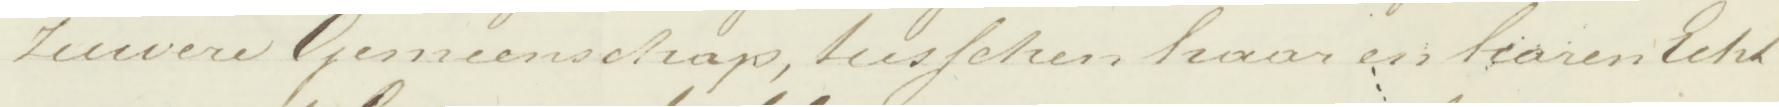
zuivere Gemeenschap, tusschen haar en haren Echt
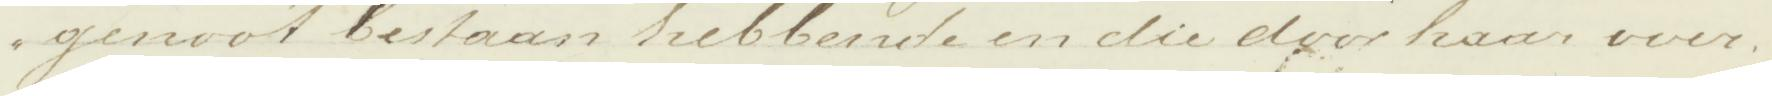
„genoot bestaan hebbende en die door haar over,
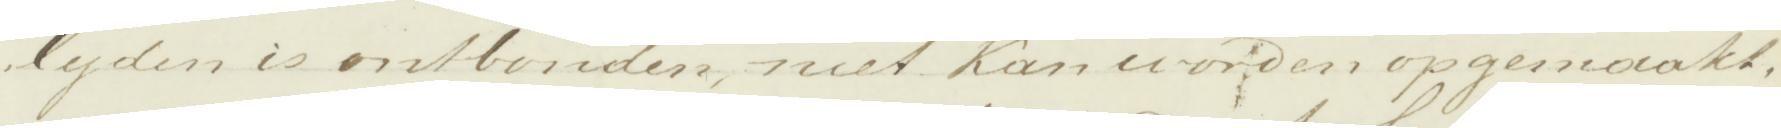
„lyden is ontbonden, niet kan worden opgemaakt
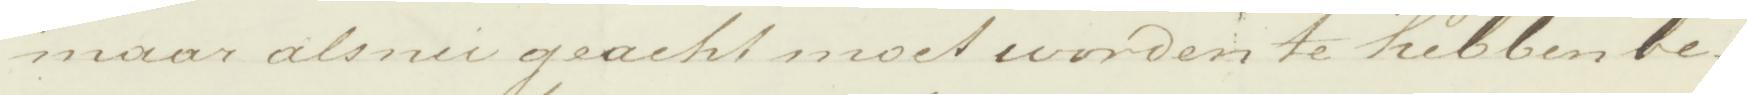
maar als nu geacht moet worden te hebben be,
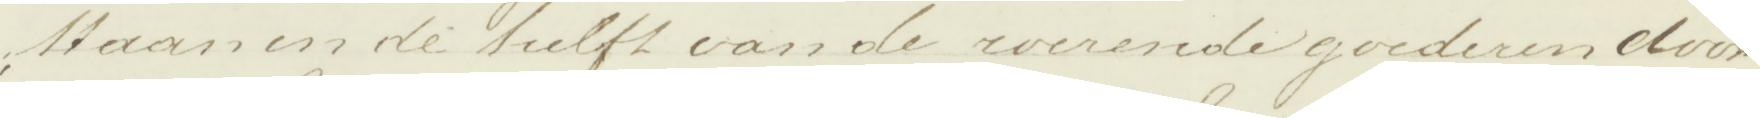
staan in de helft van de roerende goederen door
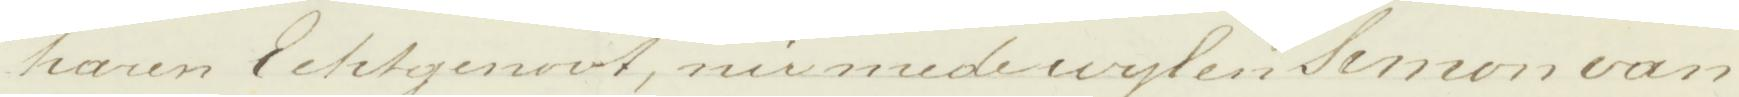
haren Echtgenoot, nu mede wylen Simon van
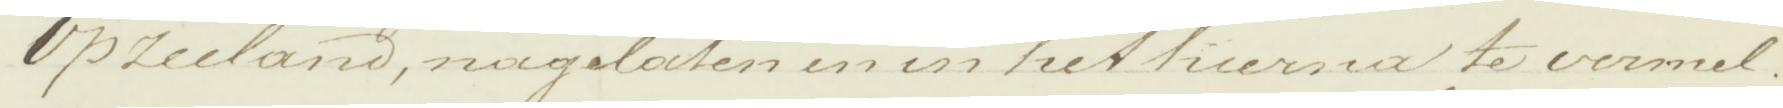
Opzeeland, nagelaten en in het hierna te vermel
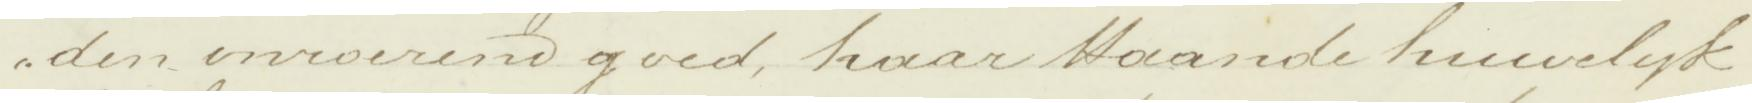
„den onroerend goed, haar staande huwelyk
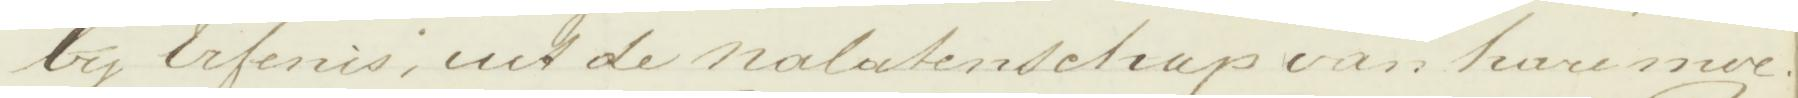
bij Erfenis, uit de nalatenschap van hare moe
